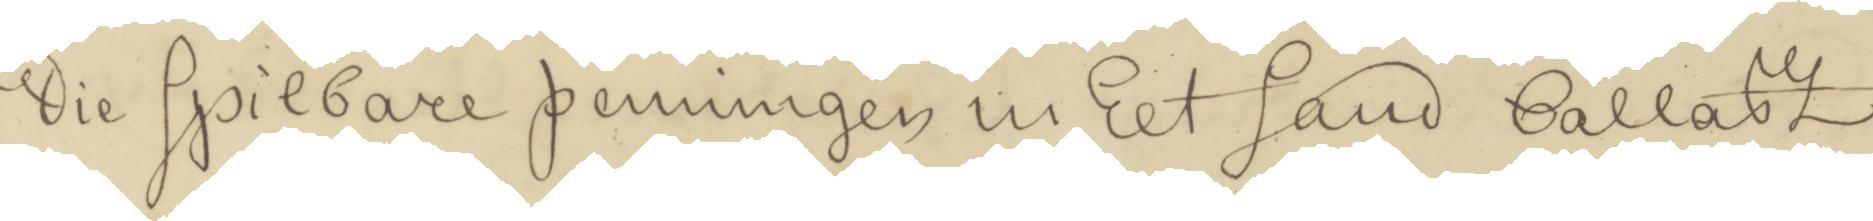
die spilbare penningen in het sand ballast
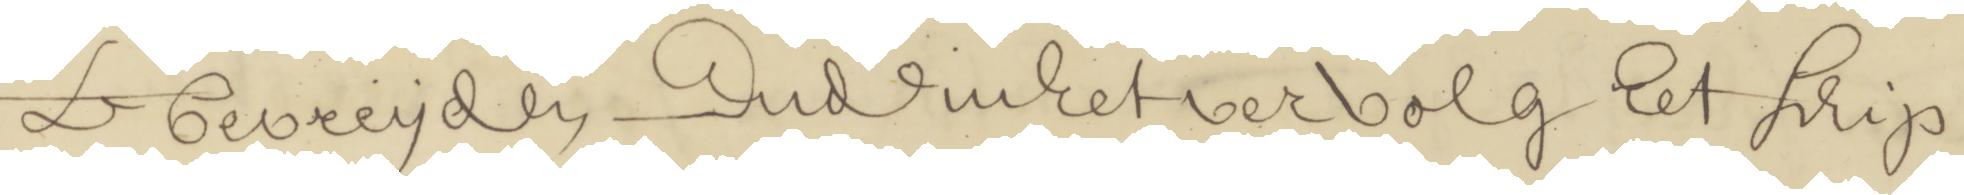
te bevreijden Ende in het vervolg het schip
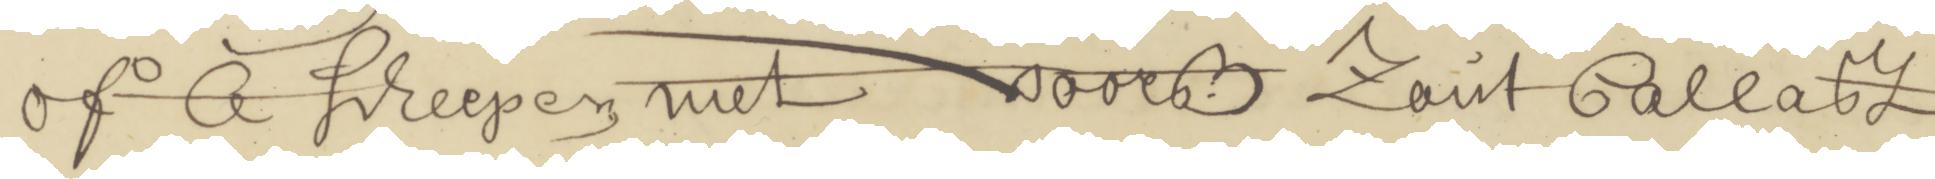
of te scheepen met voors:z zout ballast
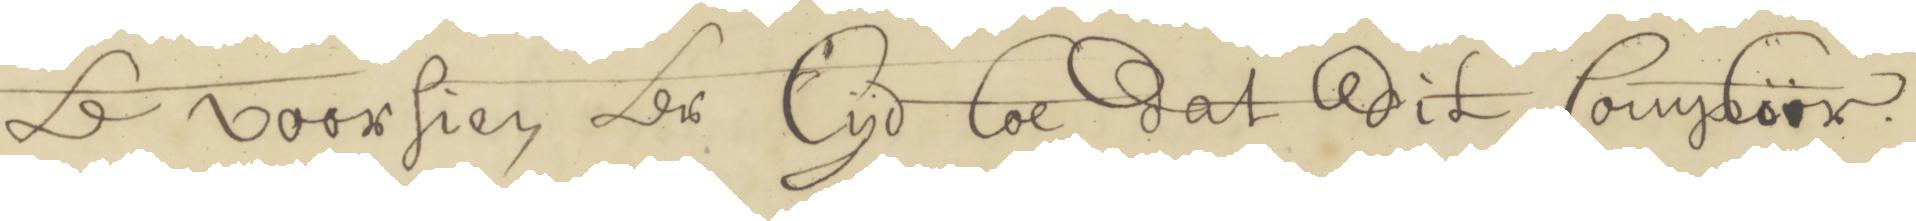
te voorsien ter tijd toe dat dit Comptoir
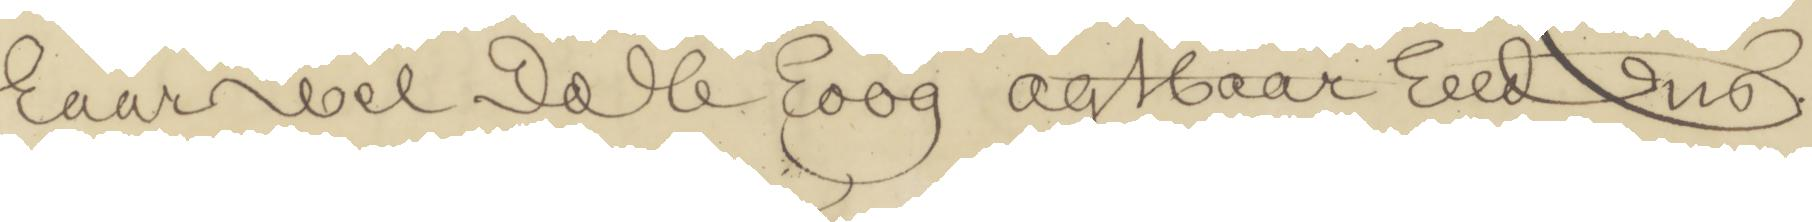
haar wel Edele hoog agtbaar heedens
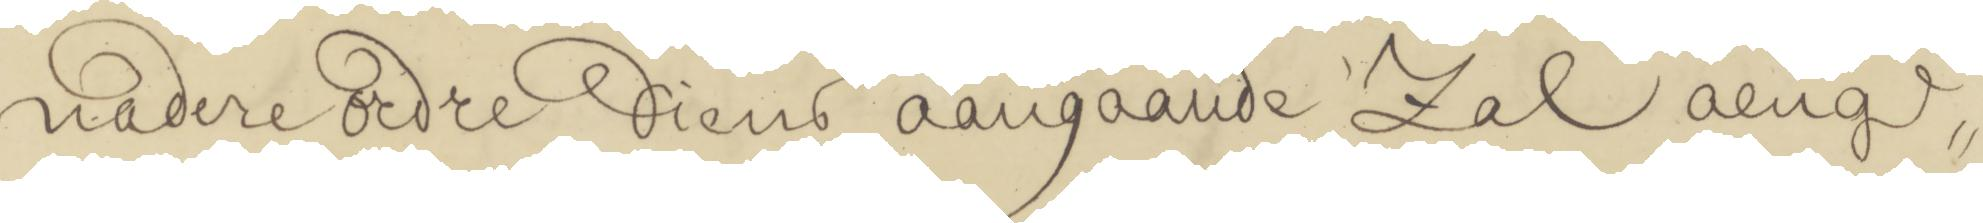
nadere ordre diens aangaande zal aenge„
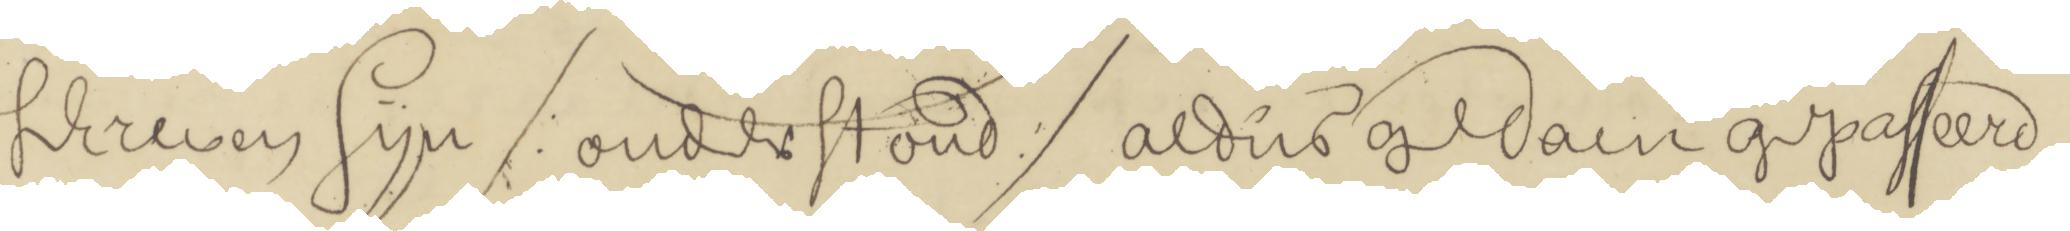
schreven sijn /: onderstond :/ aldus gedaen gepasseerd
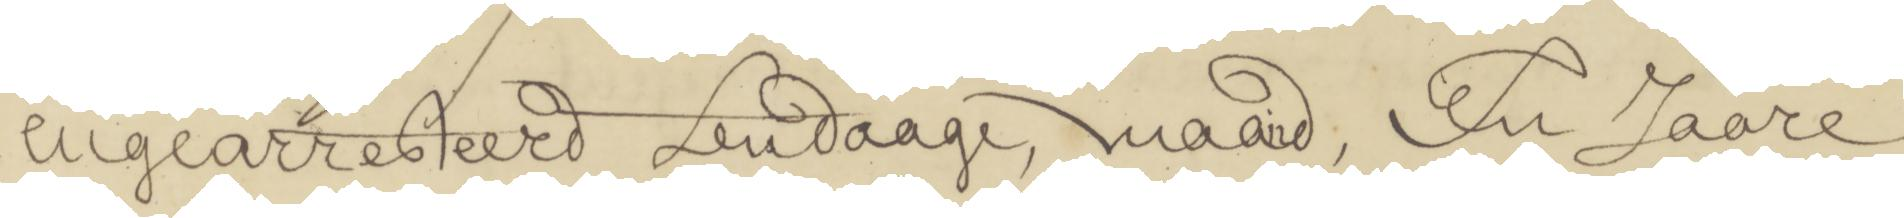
en gearresteerd tendaage, maand, En Jaare
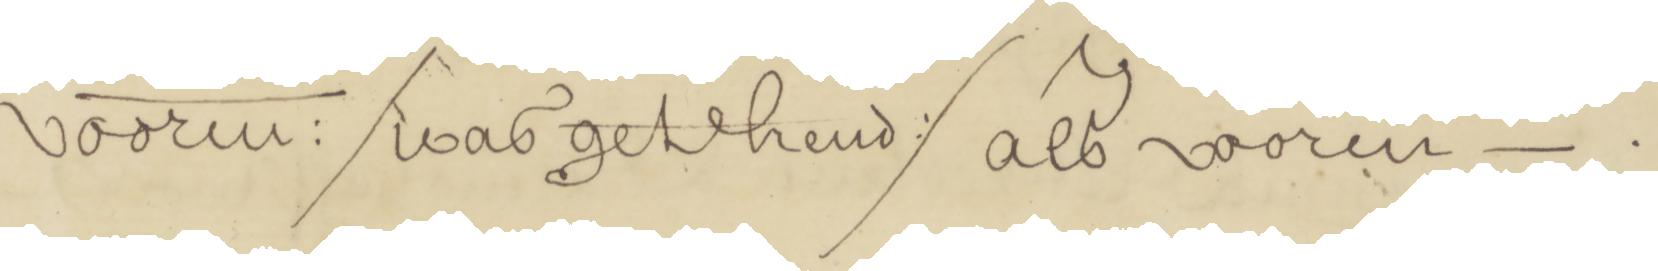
voorm: /was getekend:/ als vooren — .
